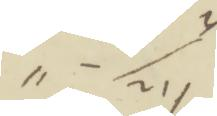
1: „
